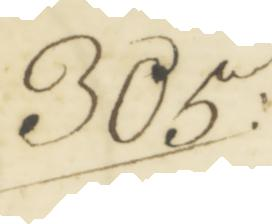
305.
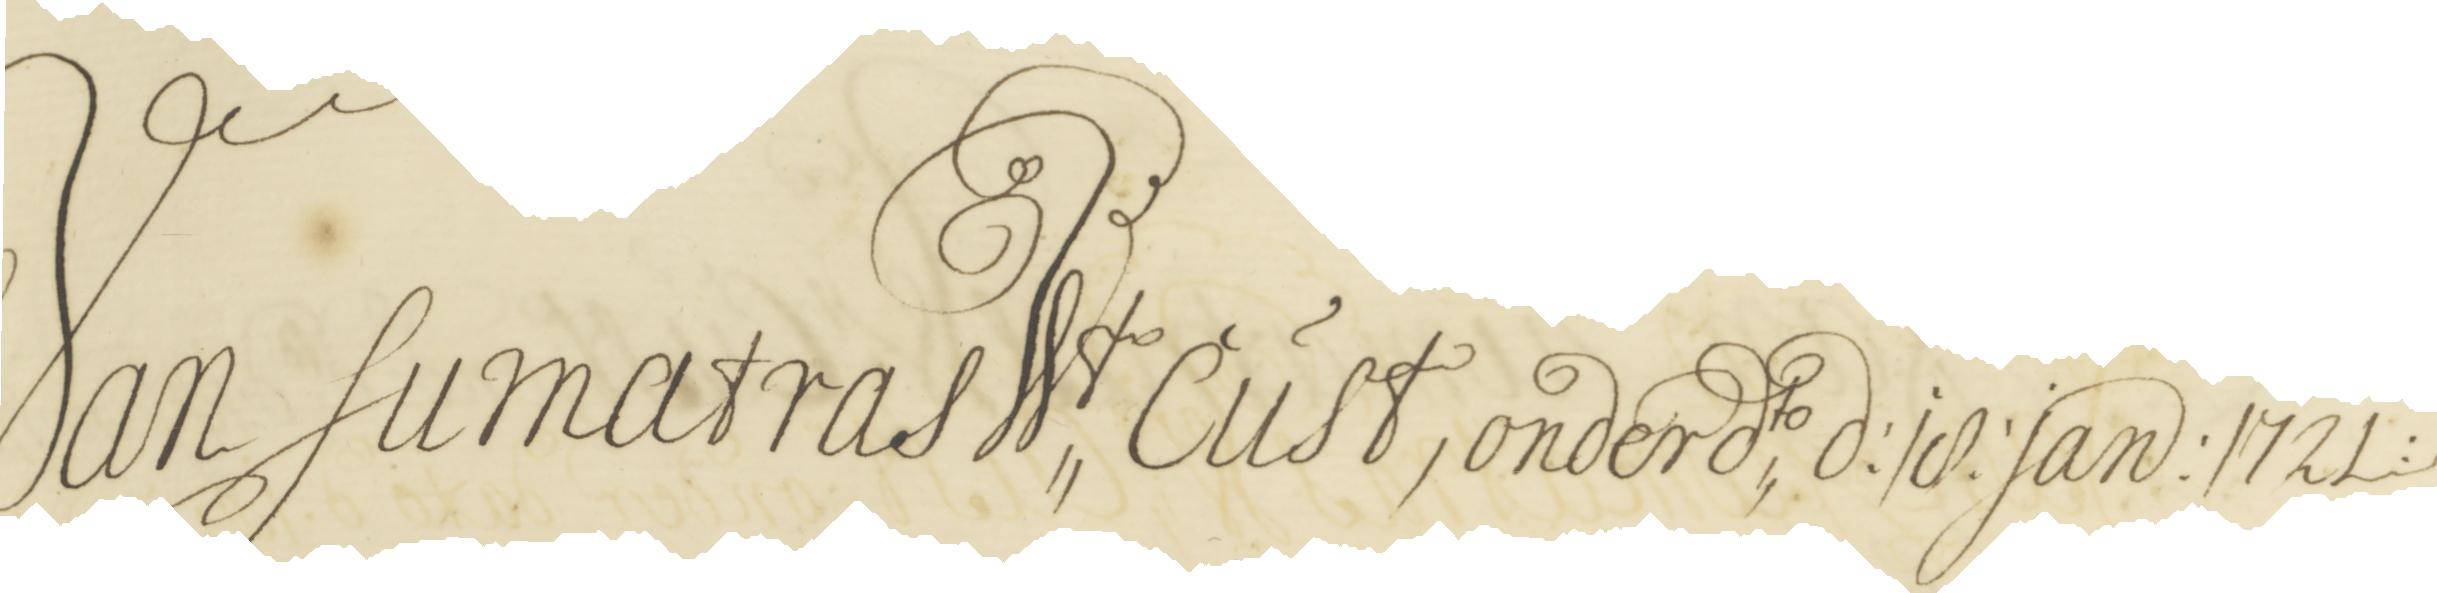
Van Sumatras W„t Cust, onder d„to d:18:jan:1721
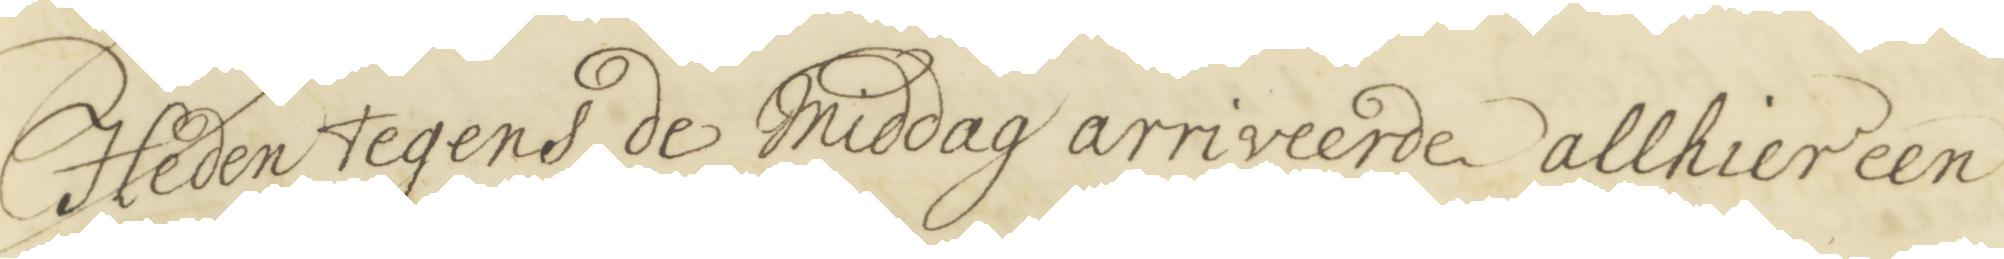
Heden tegens de middag arriveerde allhier een
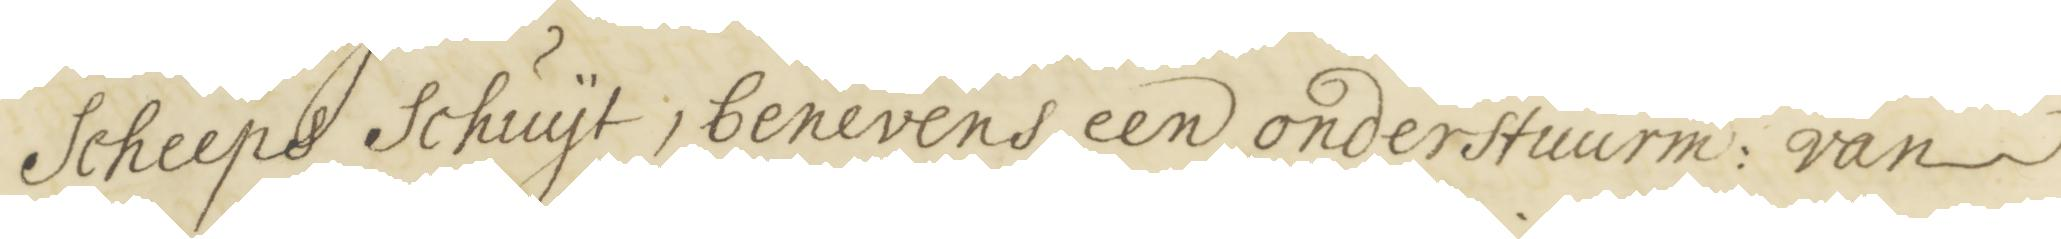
scheeps schuijt, benevens een onderstuurm: van
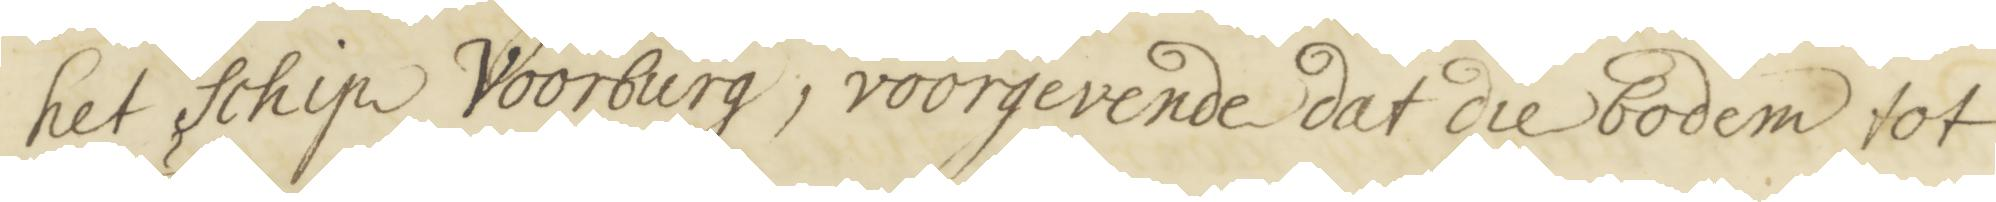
het schip Voorburg, voorgevende dat die bodem tot
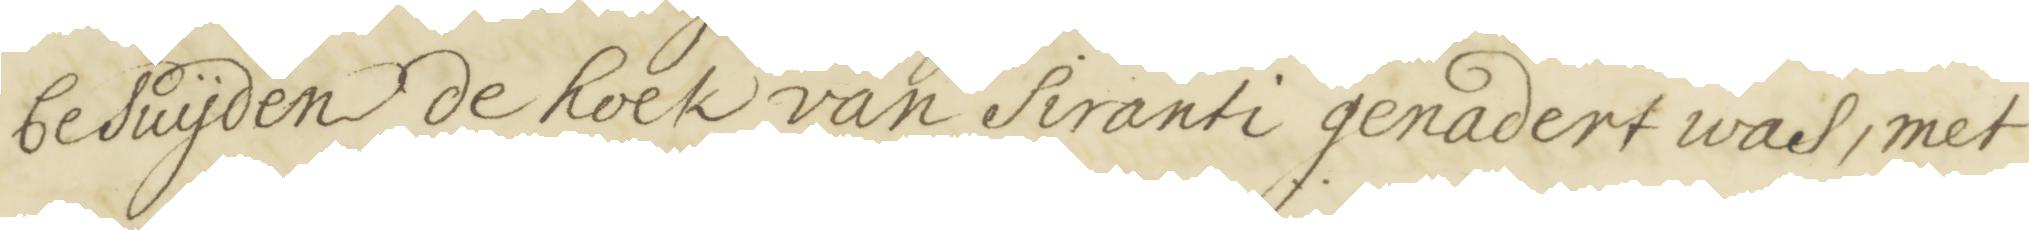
besuijden de hoek van Siranti genadert was, met
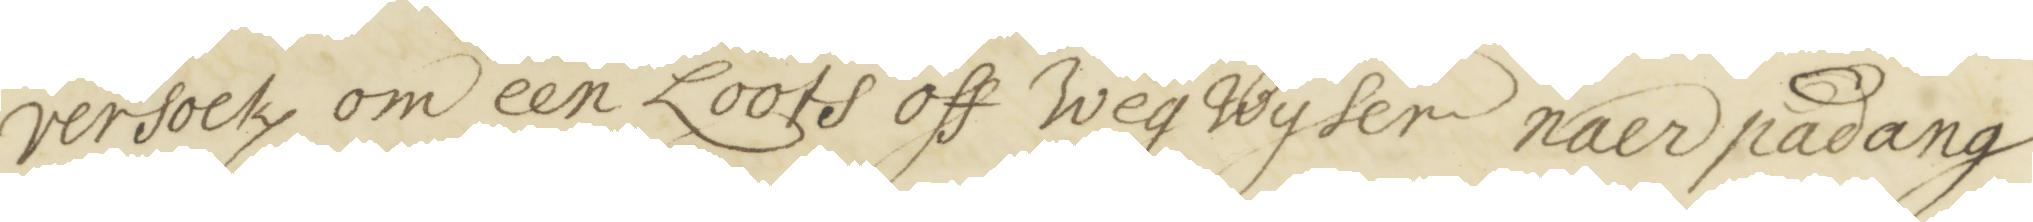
versoek, om een loots off wegwijser naer padang
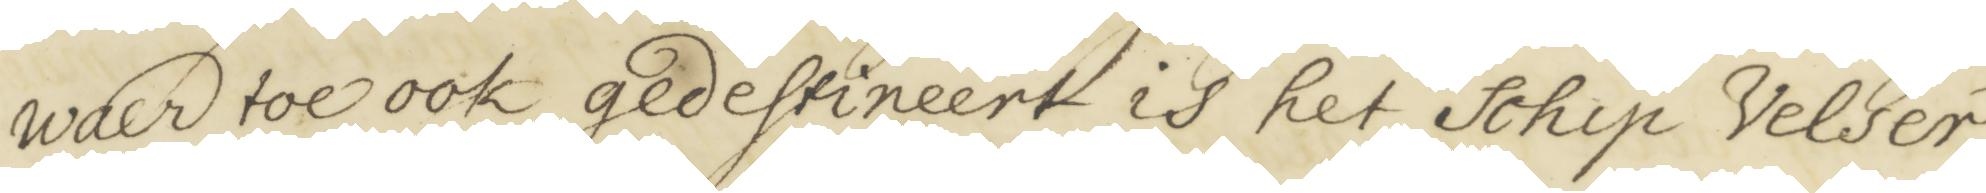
waer toe ook gedestineert is het schip Velser
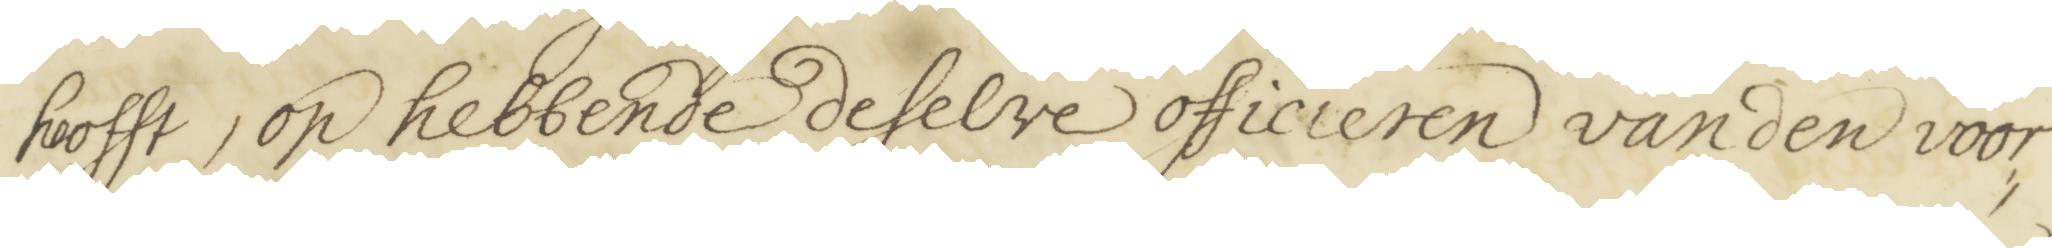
hoofft, op hebbende deselve officieren van den voor„
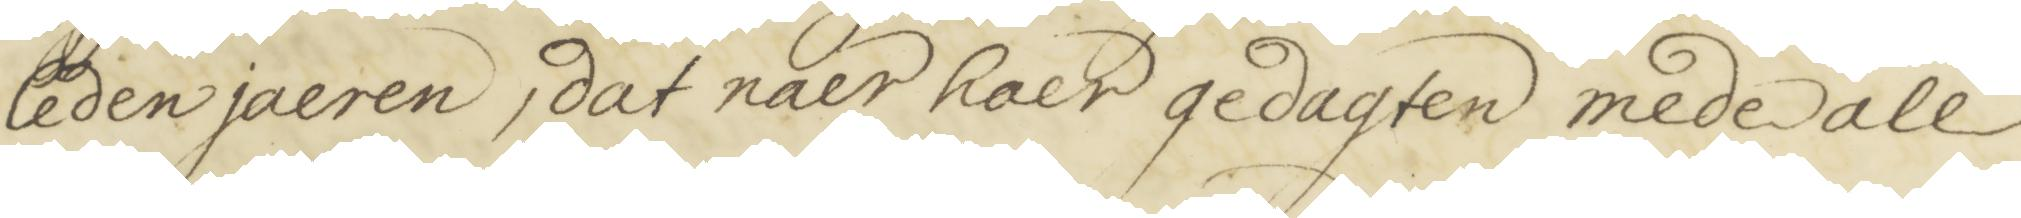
leden jaeren, dat naer haer gedagten mede all
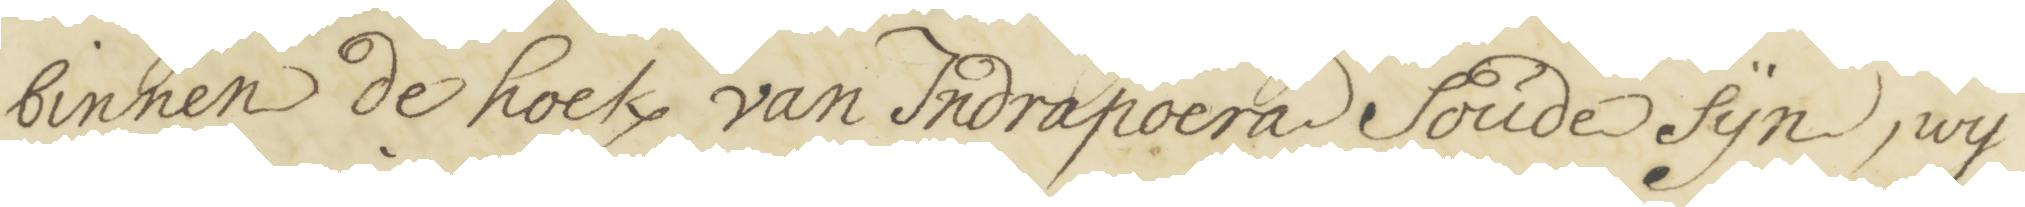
binnen de hoek van Indrapoera soude sijn, wij
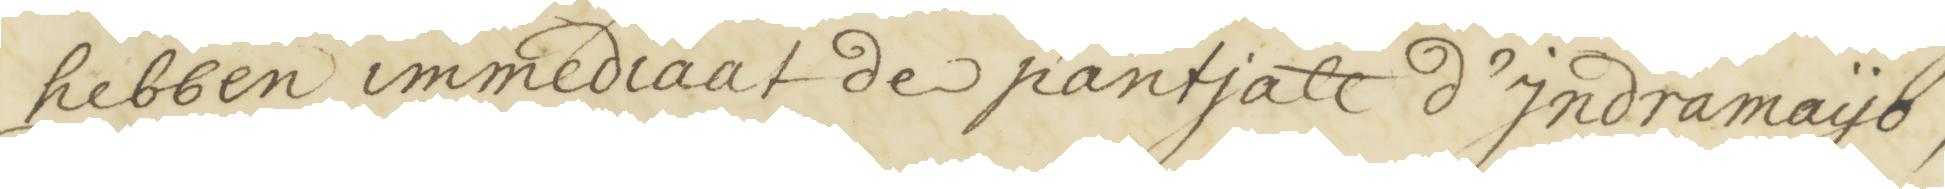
hebben immediaat de pantjall d’ Jndramaijo,
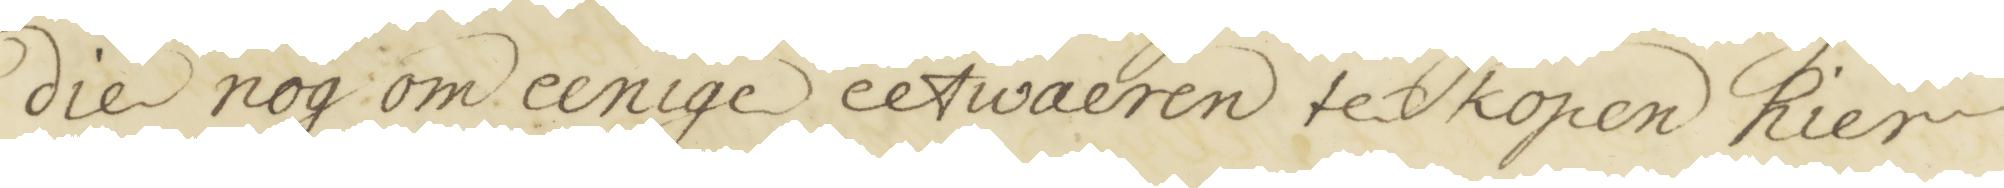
die nog om eenige eetwaeren te kopen hier
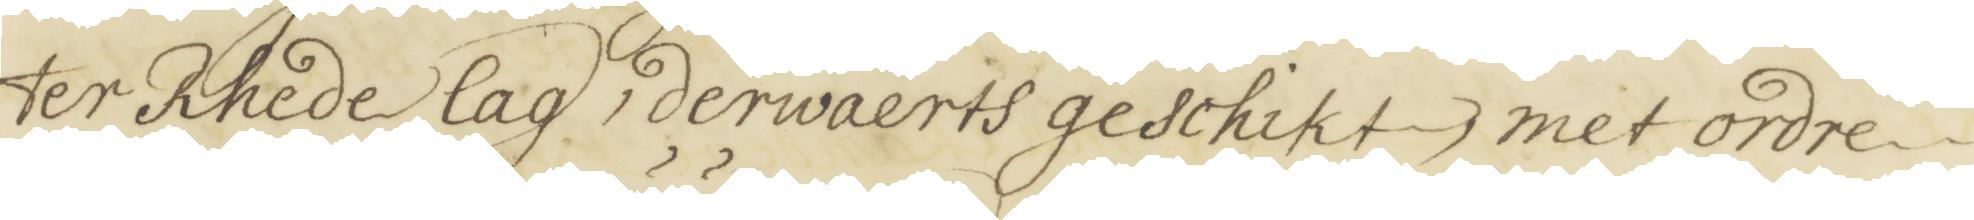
ter Rhede lag, derwaerts geschikt, met ordre
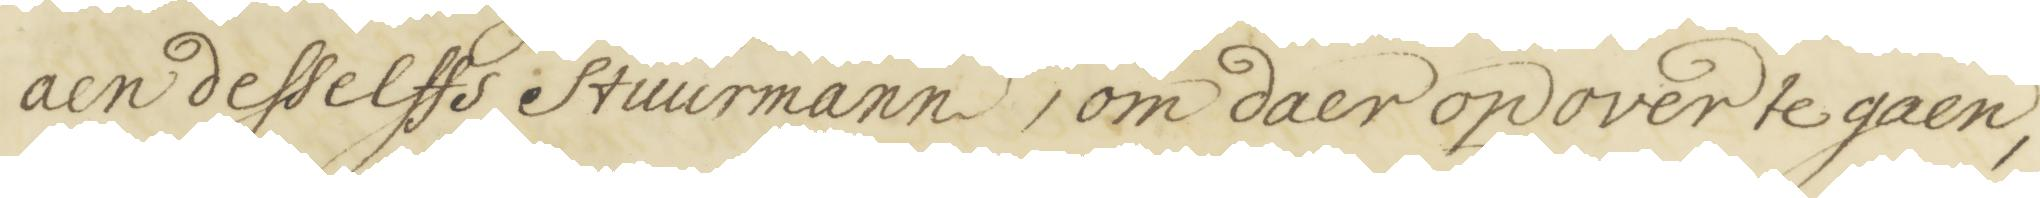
aen desselffs stuurmann, om daer op over te gaen,
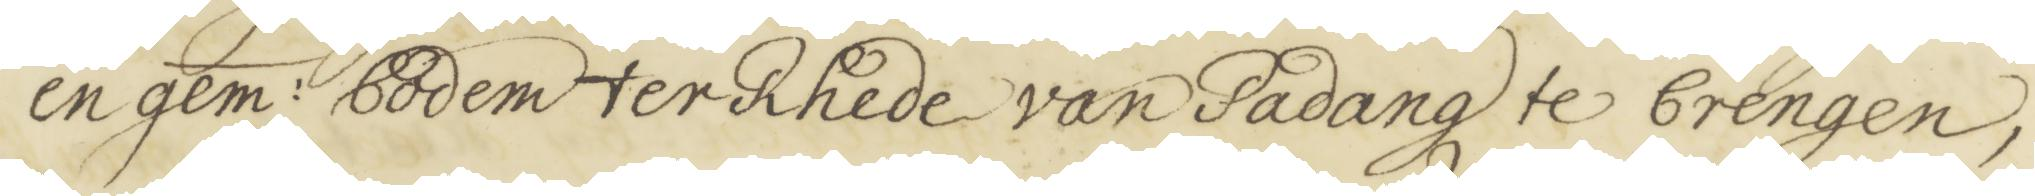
en gem: bodem ter Rhede van Padang te brengen,
